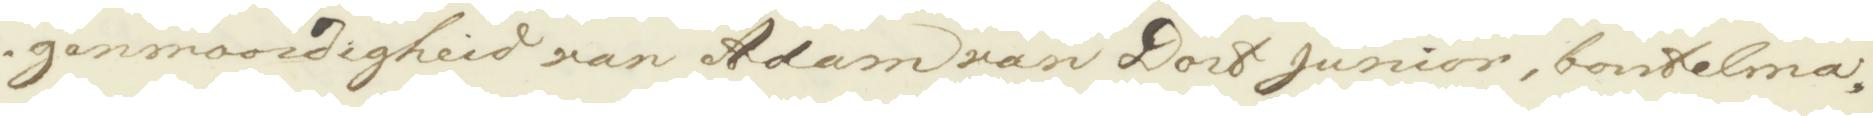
„genwoordigheid van Adam van Dort junior, borstelma„
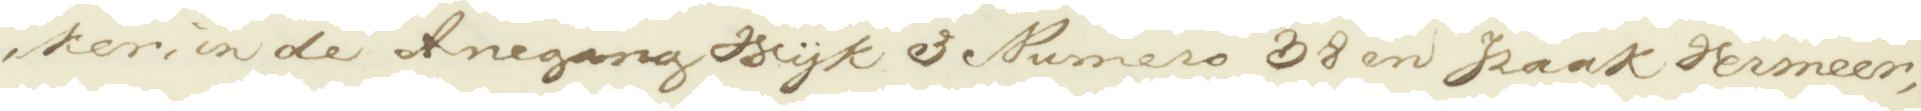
,ker, in de Anegang Wijk 3 Numero 38 en Jzaak Vermeer
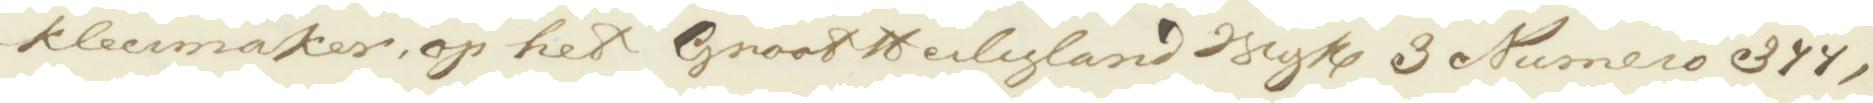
kleermaker, op het Groot Heiligland Wyk 3 Numero 377,
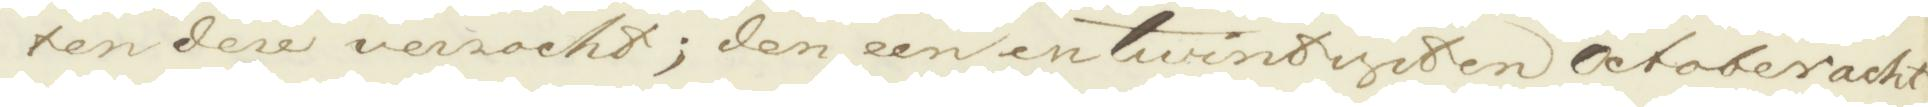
ten deze verzocht; den een en twintigten October acht
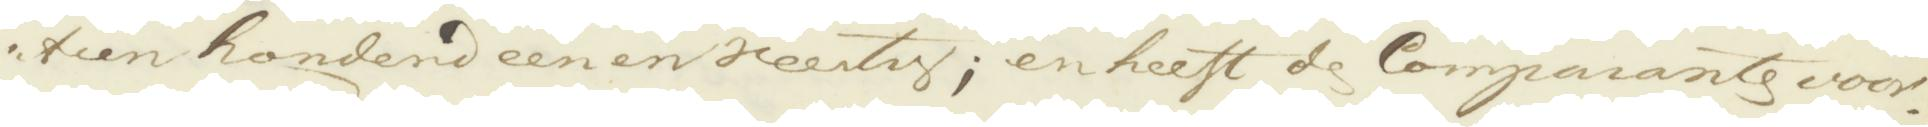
„tien honderd een en veertig; en heeft de Comparante voor
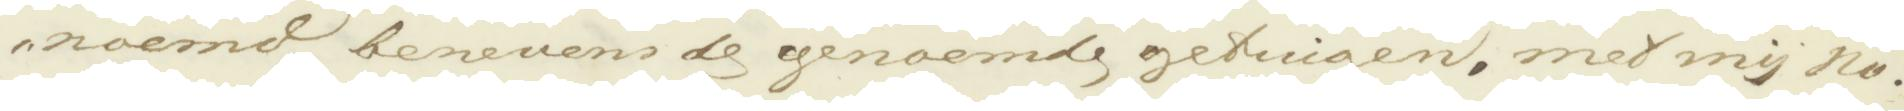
„noemd benevens de genoemde getuigen, met mij no
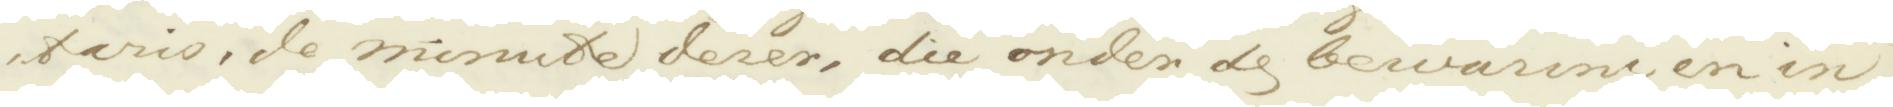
„taris, de minute dezer, die onder de bewaring en in
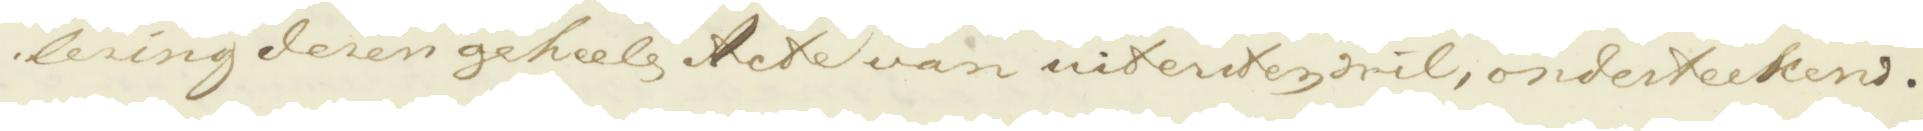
lezing dezen geheele Acte van uitersten wil, onderteekend.
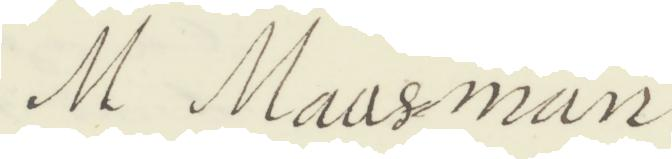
M Maasman
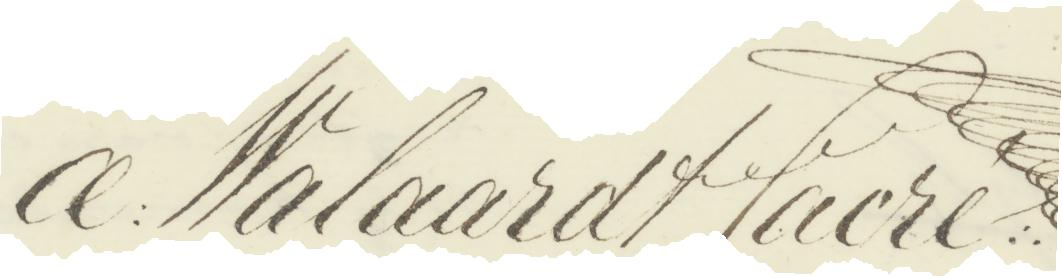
a: Walaardt Sacré .:
